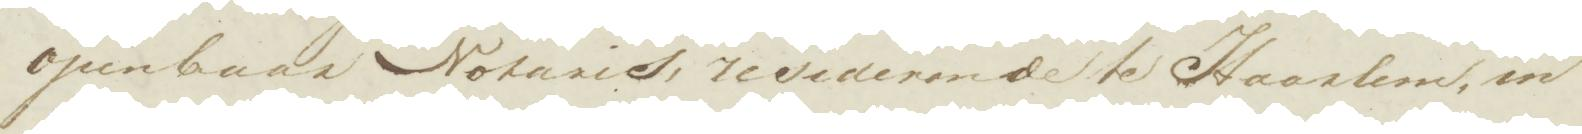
openbaar Notaris, residerende te Haarlem, in
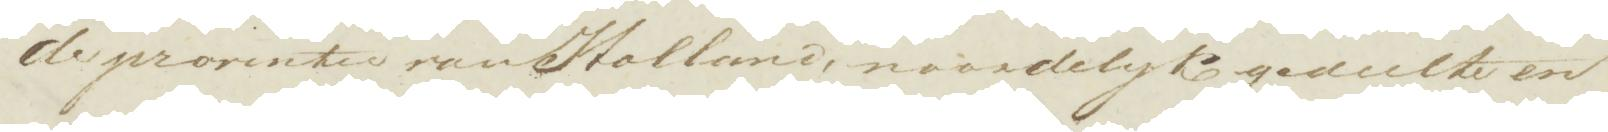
de provintie van Holland, noordelyk gedeelte en
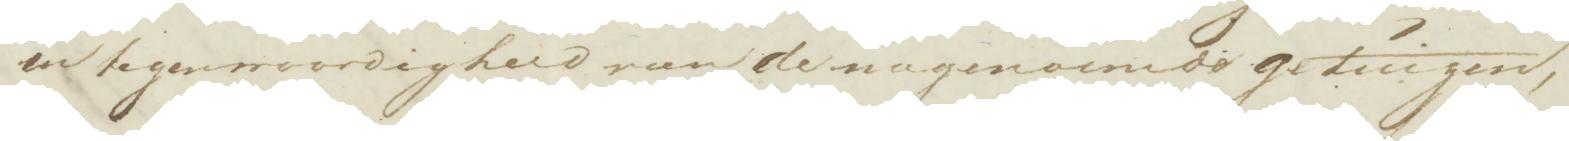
in tegenwoordigheid van de nagenoemde getuigen,
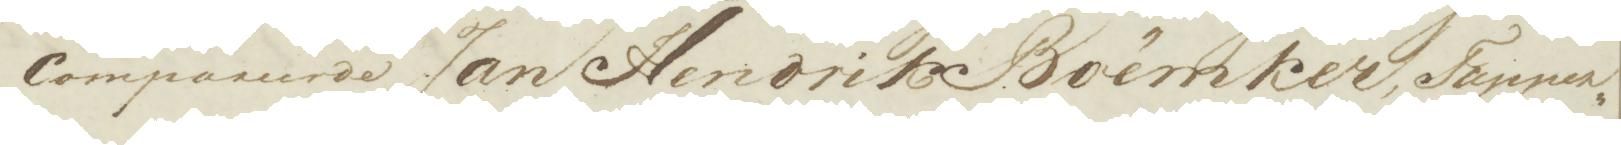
Compareerde Jan Hendrik Boëmker, Tapper„
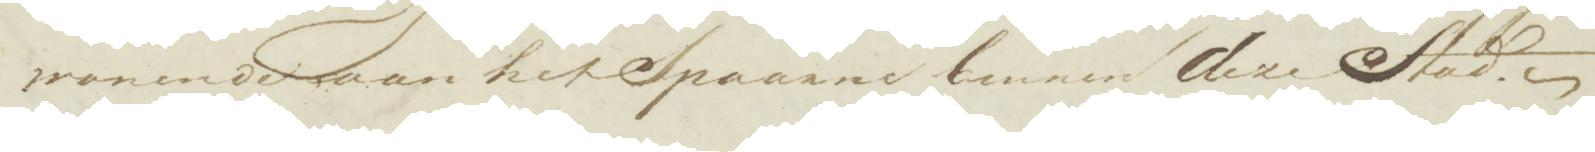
wonende aan het Spaarne binnen deze Stad.
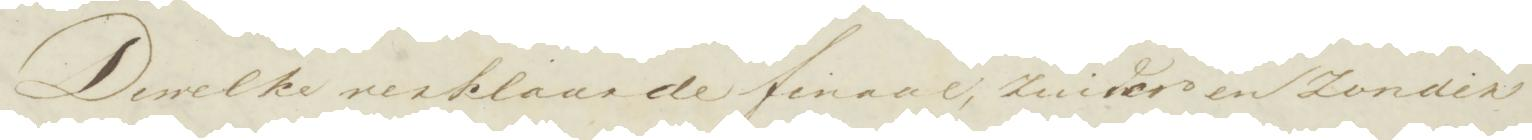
Dewelke verklaarde finaal, zuiver en zonder
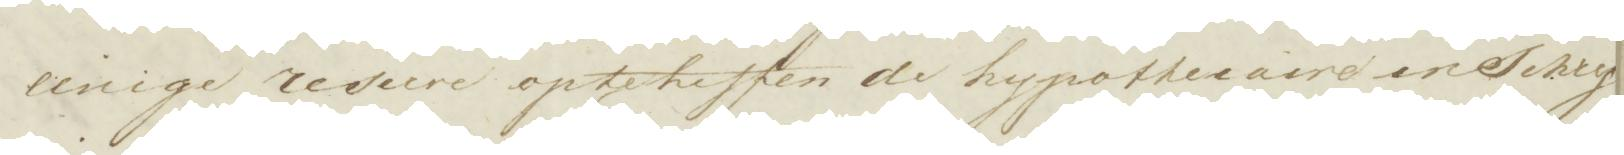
eenige reserve op te heffen de hypothecaire inschry
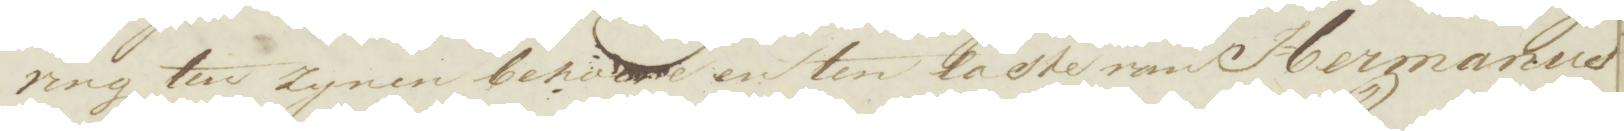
=ving ten zynen behoeve en ten laste van Hermanus
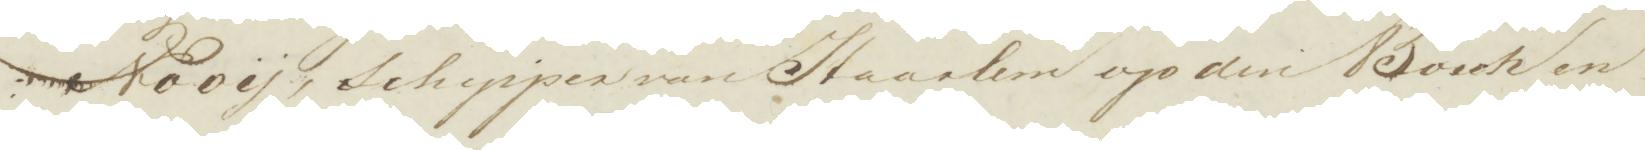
Kooij, schipper van Haarlem op den Bosch en
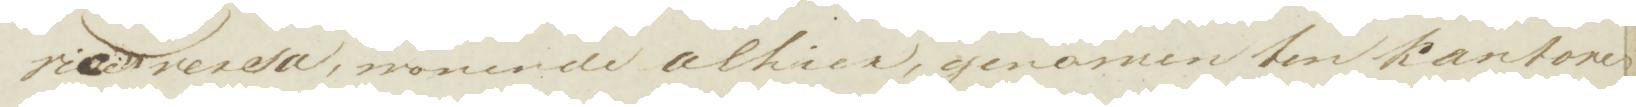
vice versa, wonende alhier, genomen ten kantore
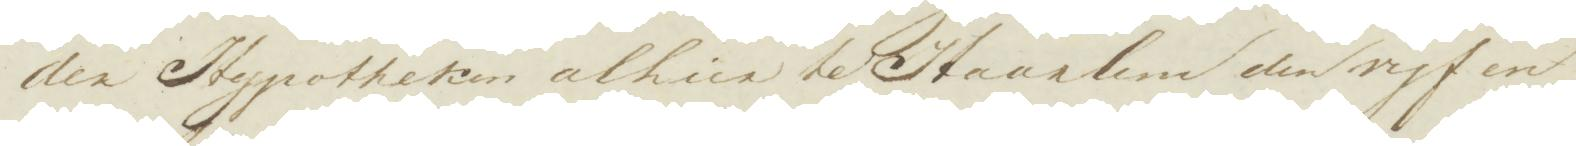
der Hypotheken alhier te Haarlem den vyf en
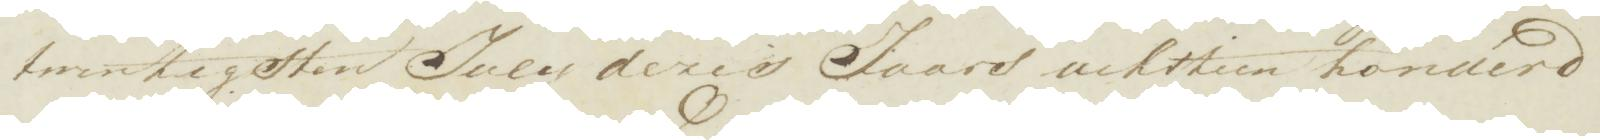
twintigsten July dezes Jaars achttien honderd
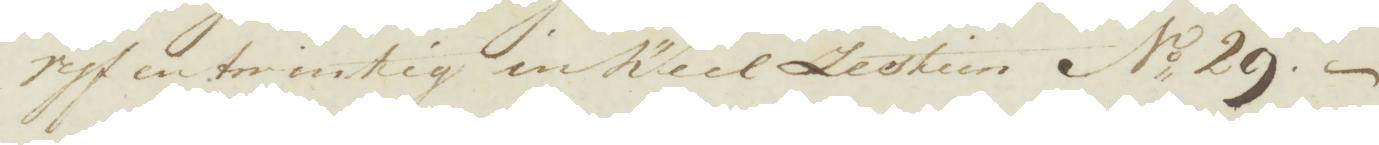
vyf en twintig in Deel zestien N„o 29.
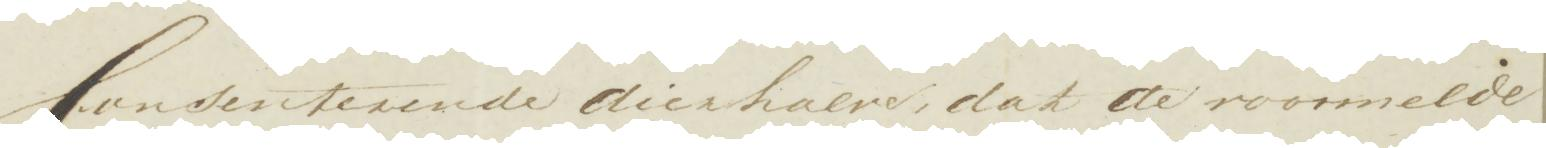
Consenterende dierhalve, dat de voormelde
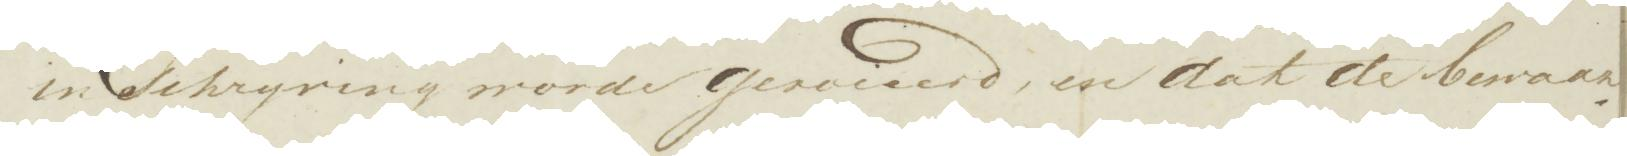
in schryving worde geroieerd, en dat de bewaar„
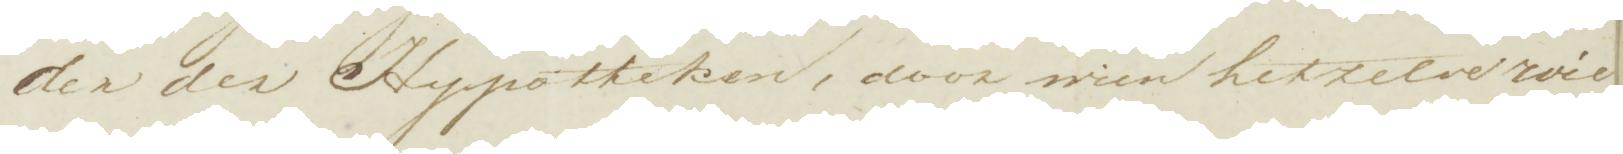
=der der Hypotheken, door wien hetzelve roie
